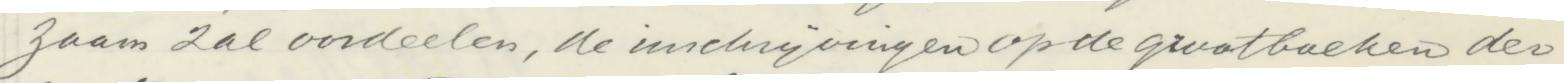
zaam zal oordeelen, de inschrijvingen op de grootboeken der
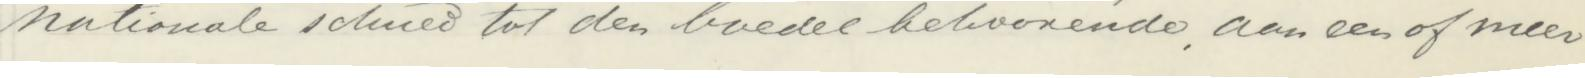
nationale schuld tot den boedel behoorende, aan een of meer
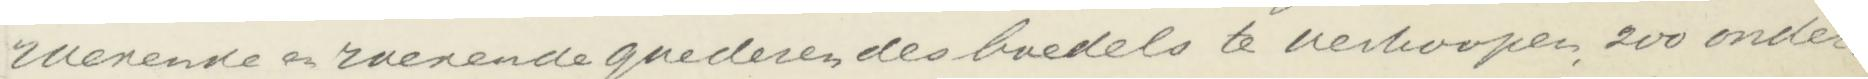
roerende en roerende goederen des boedels te verkoopen, zoo onder
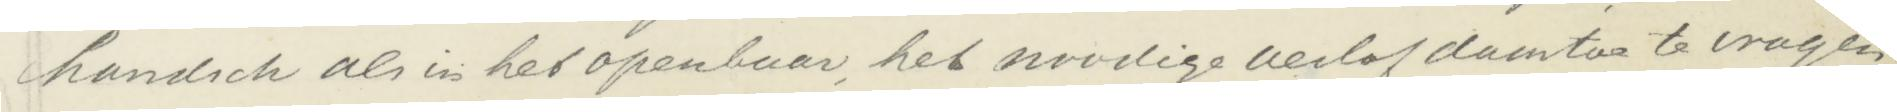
handsch als in het openbaar, het noodige verlof daartoe te vragen
